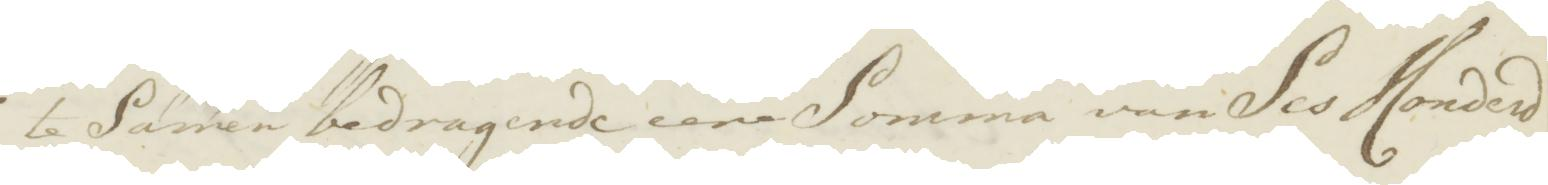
te Samen bedragende eene Somma van Ses Honderd
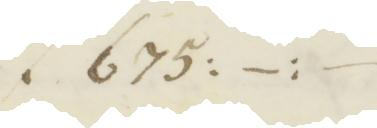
ƒ 675: —: —
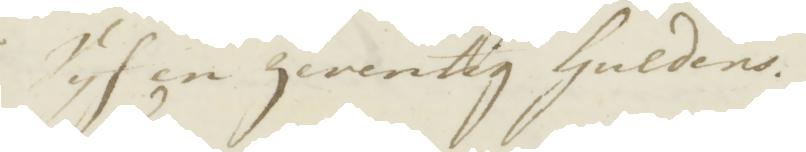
Vijf en zeventig Guldens.
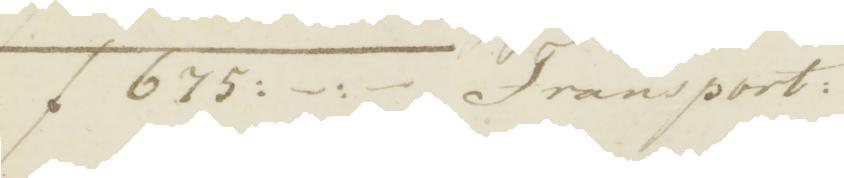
ƒ 675: — : — Transport:
